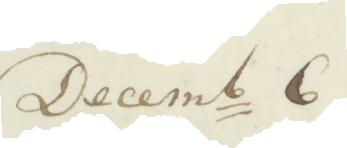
Decemb 6
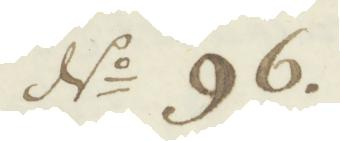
N=o 96.
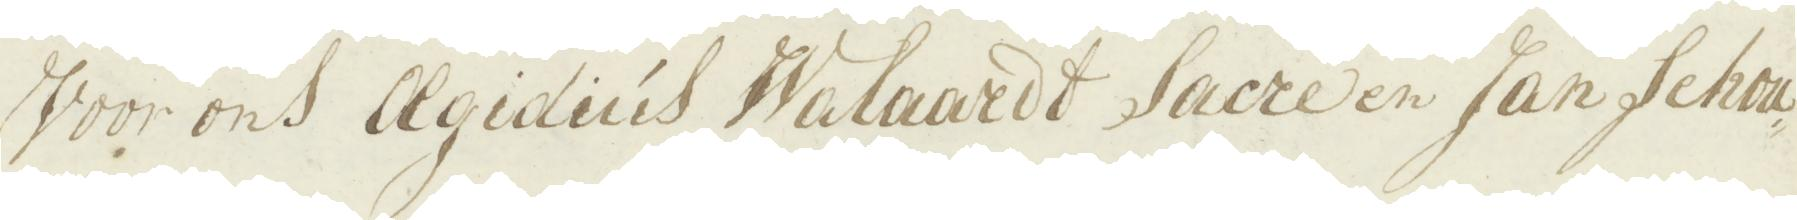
Voor ons AEgidius Walaardt Sacré en Jan Schou„
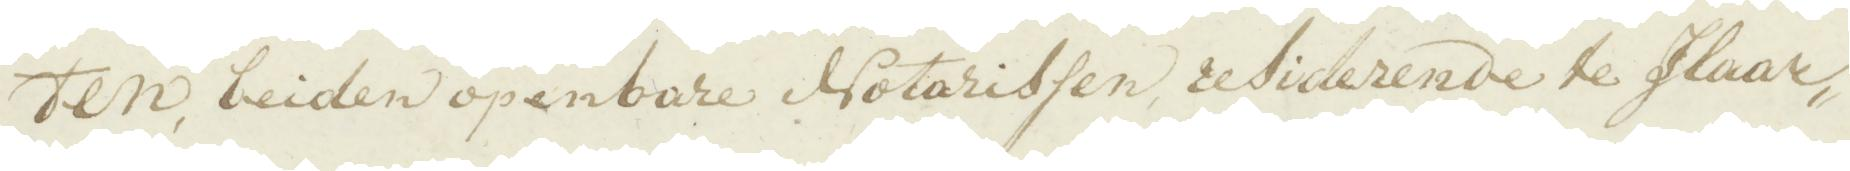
ten, beiden openbare Notarissen, residerende te Haar„
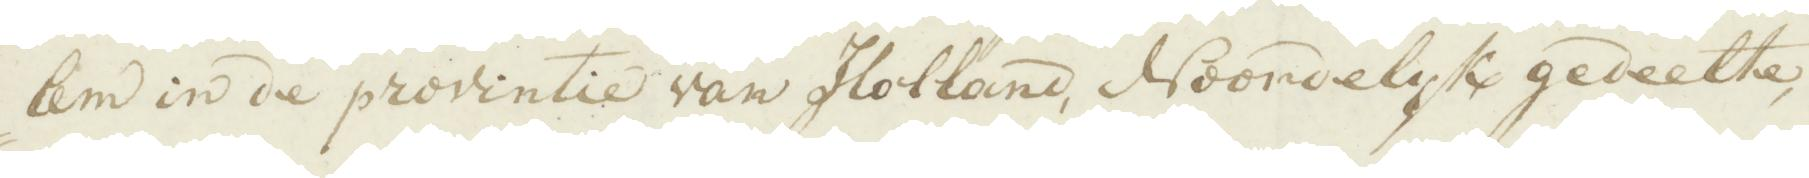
lem in de provintie van Holland, Noordelyk gedeelte,
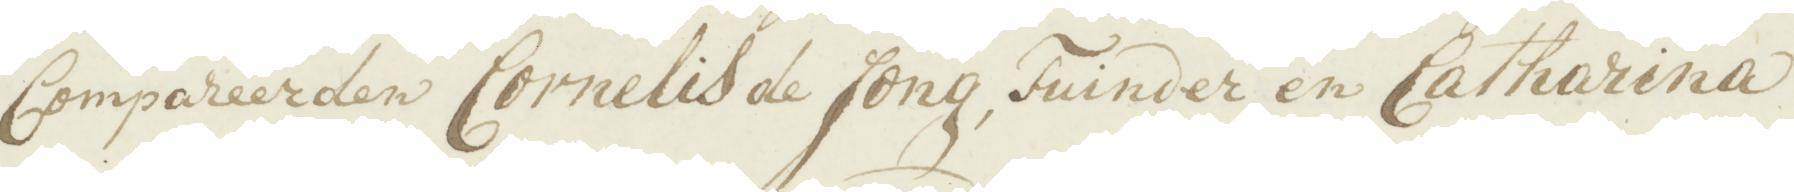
Compareerden Cornelis de Jong, Tuinder, en Catharina
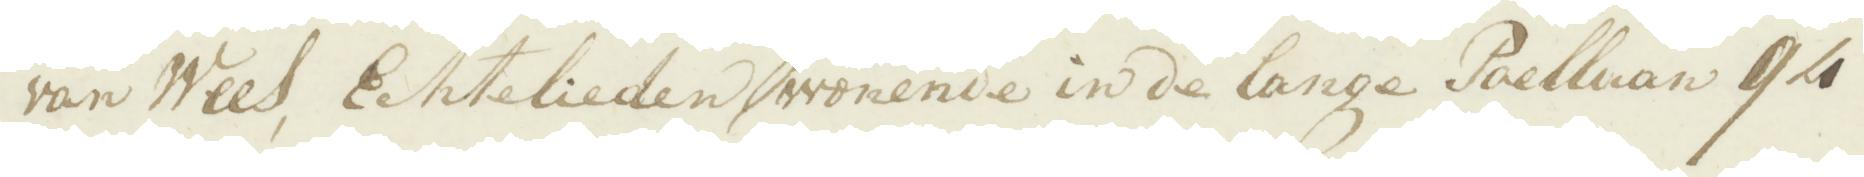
van Wees, Echtelieden, wonende in de lange Poellaan 94
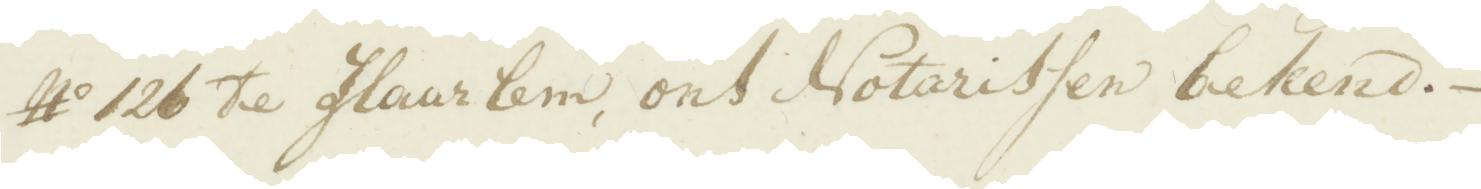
N=o 126 te Haarlem, ons Notarissen bekend. –
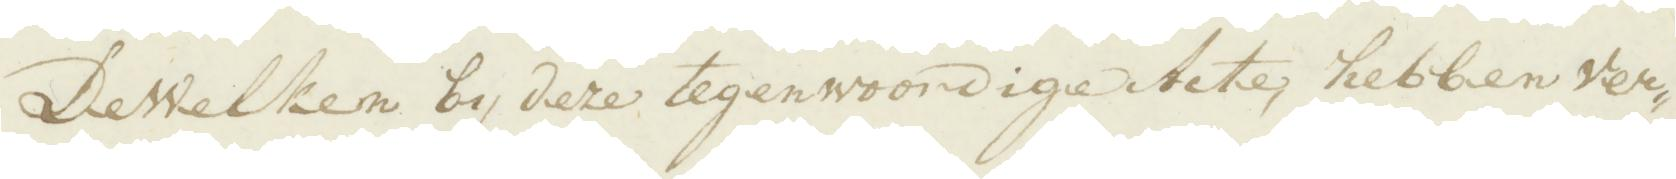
Dewelken by deze tegenwoordige Acte, hebben ver„
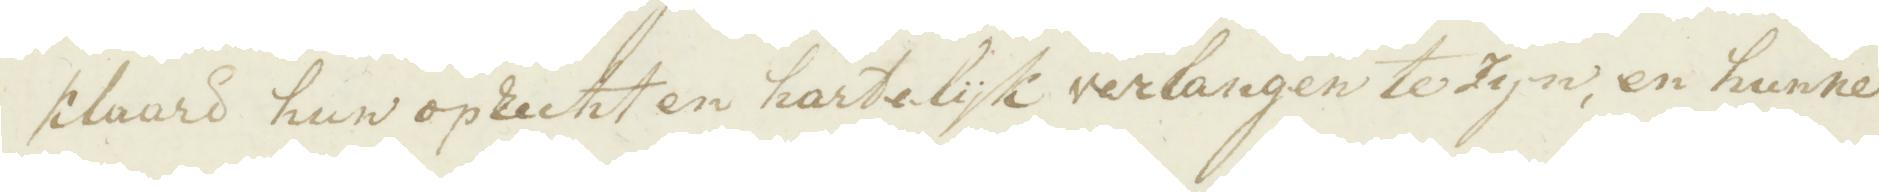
klaard hun oprecht en hartelijk verlangen te zyn, en hunne
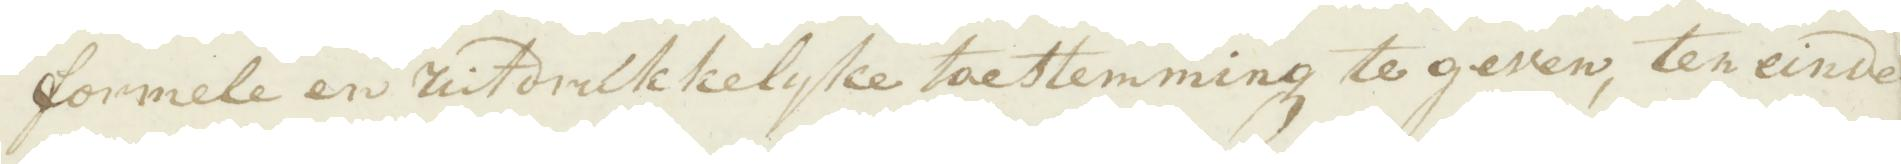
formele en uitdrukkelyke toestemming te geven, ten einde
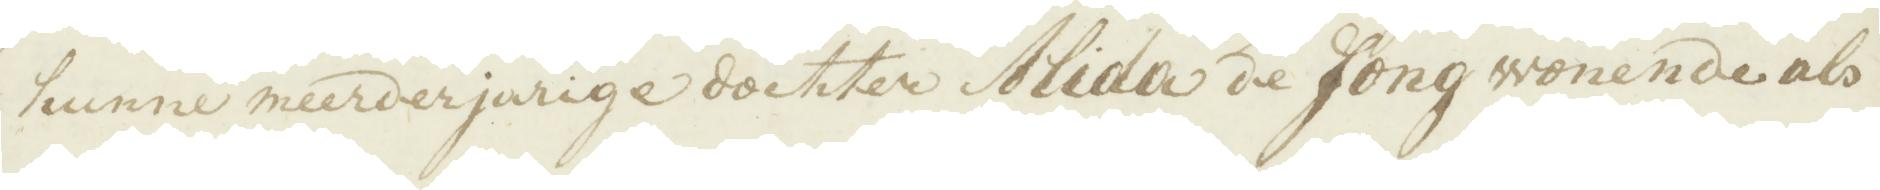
hunne meerderjarige dochter Alida de Jong wonende als
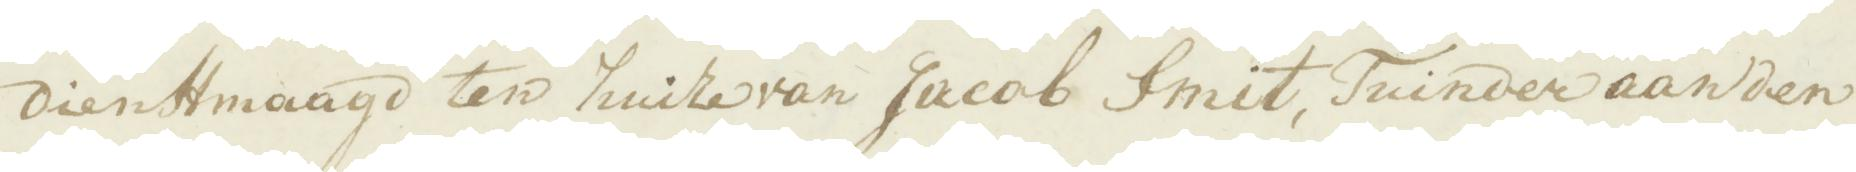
dienstmaagd ten huize van Jacob Smit, Tuinder aan den
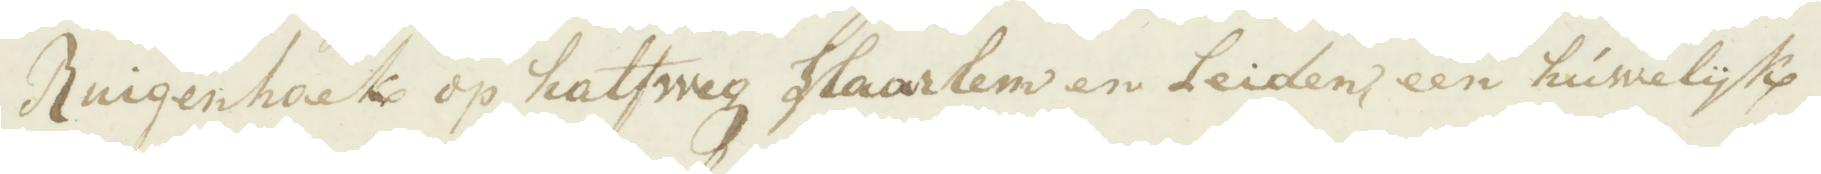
Ruigenhoek op halfweg Haarlem en Leiden een huwelijk
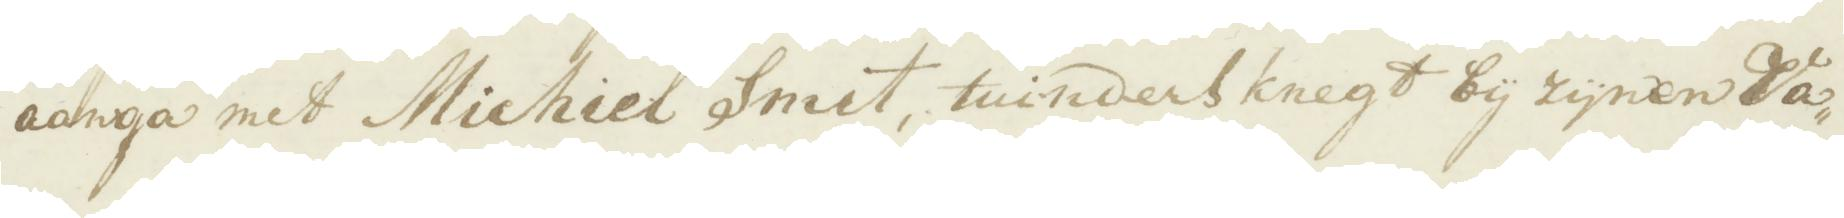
aanga met Michiel Smit, tuinders knegt bij zijnen Va„
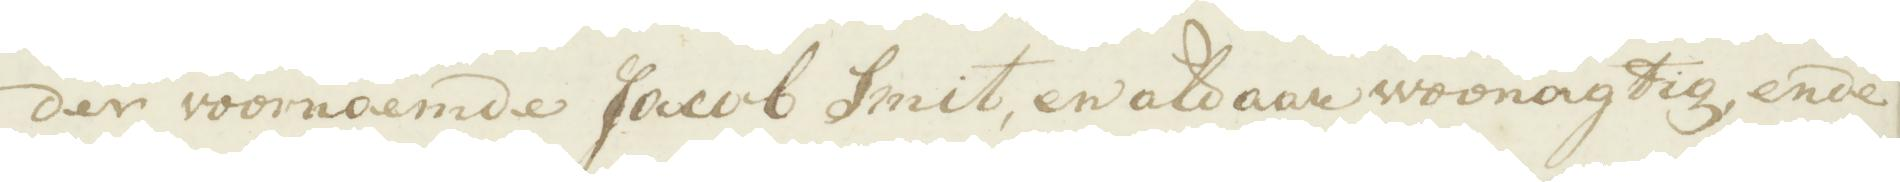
der voornoemde Jacob Smit, en aldaar woonagtig, ende
